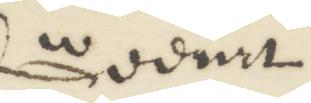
Geeurt
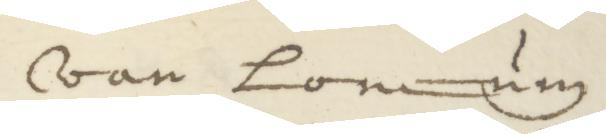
van Loncum
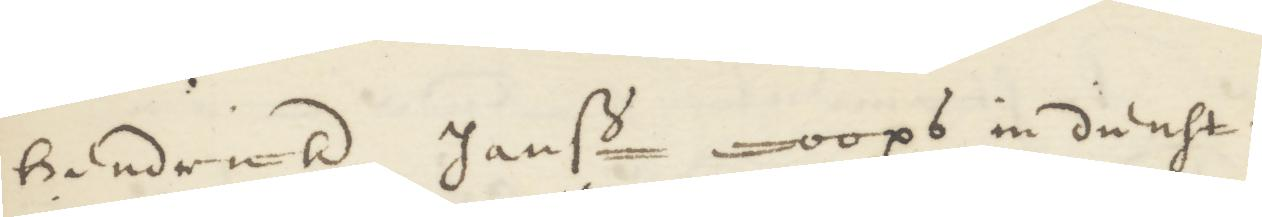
hendrick Jans=t coops in dienst
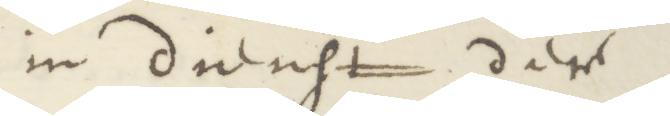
in dienst der
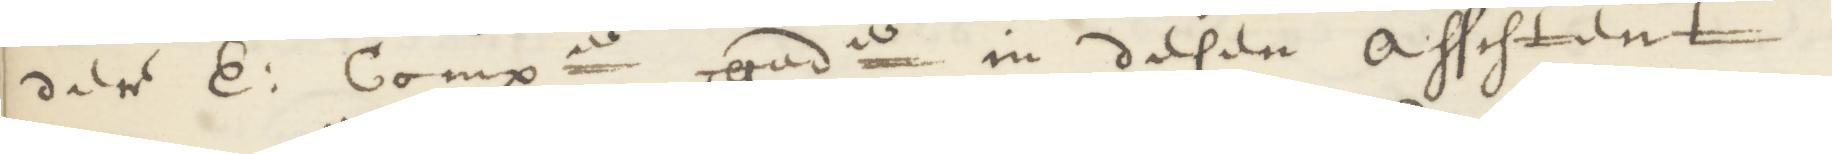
der E: Comp=e ged=t in desen assistent
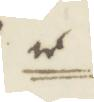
=r
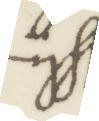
Eijss
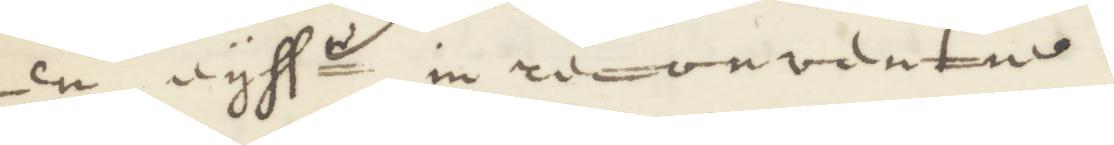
en eijss=r in reconventie
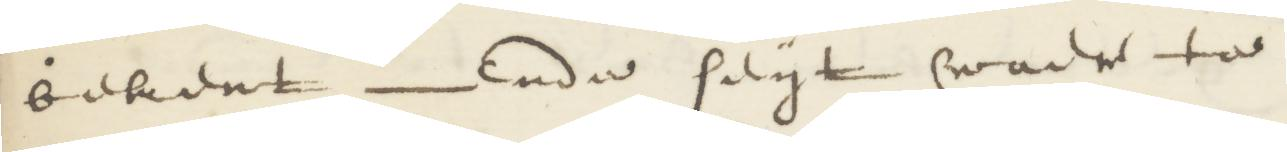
bekent ende seijt waer te
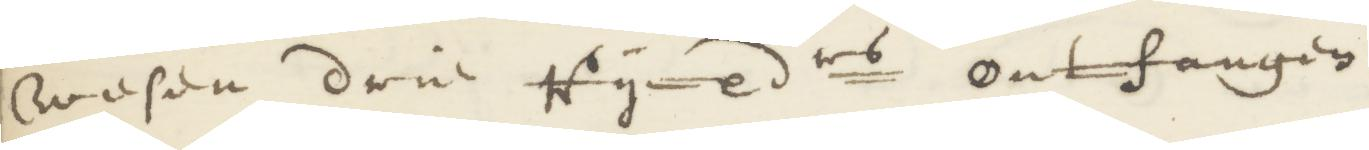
wesen drie Rijcxd=rs ontfangen
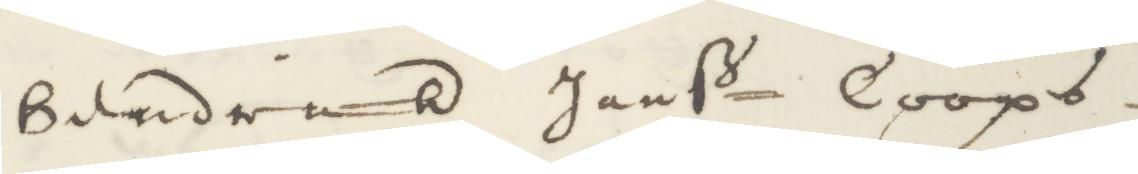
hendrick Jans=z Coops
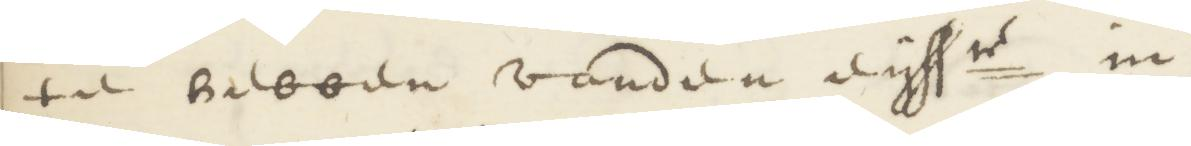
te hebben van den eijss=r in
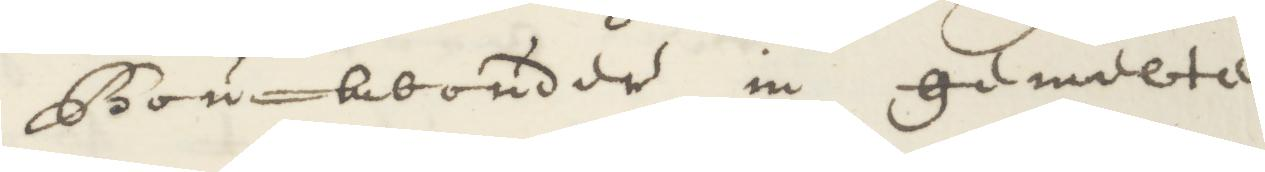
Bouckhouder in gemelte
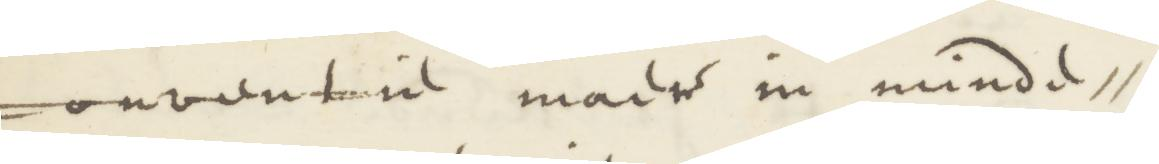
conventie maer in minde„
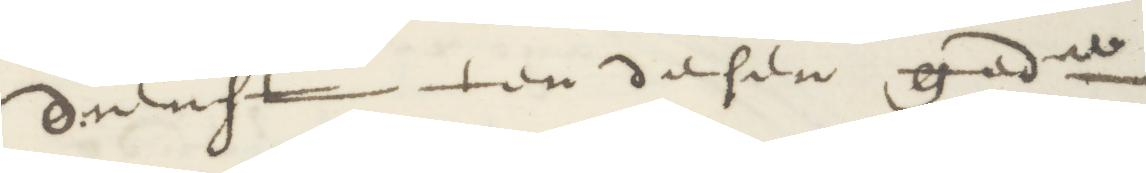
dienst ten desen ged-e
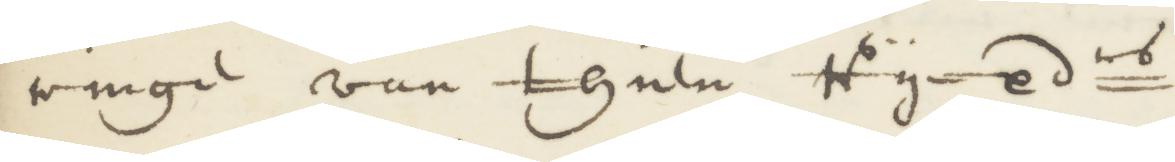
ringe van thien Rijcxs=rs
